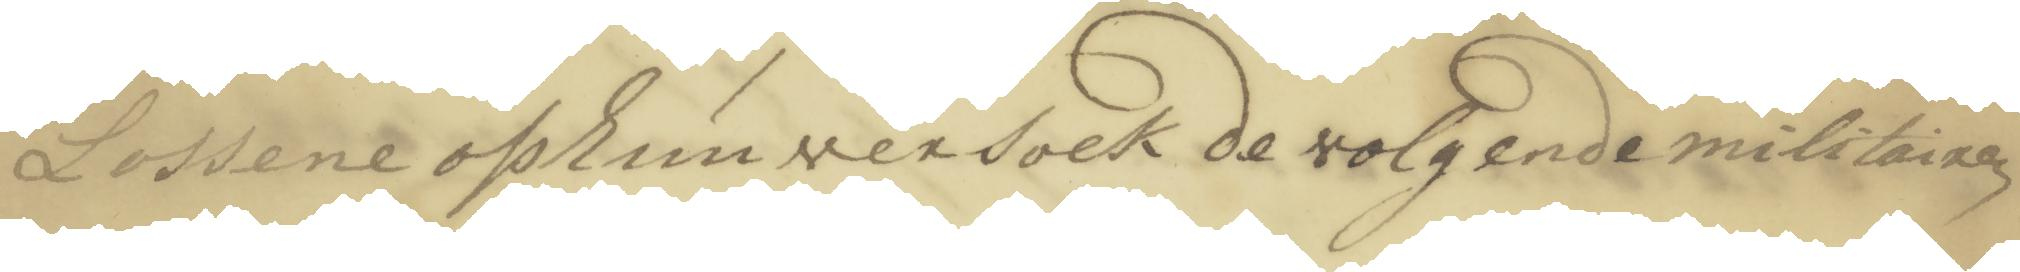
lossene op hun versoek de volgende militairen
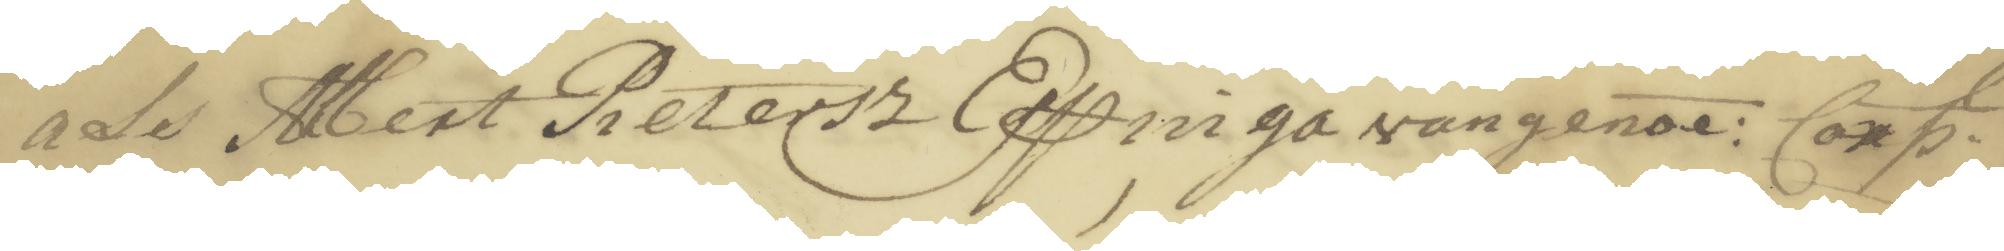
als Albert Pietersz Eppinga van genoe: Corp:l
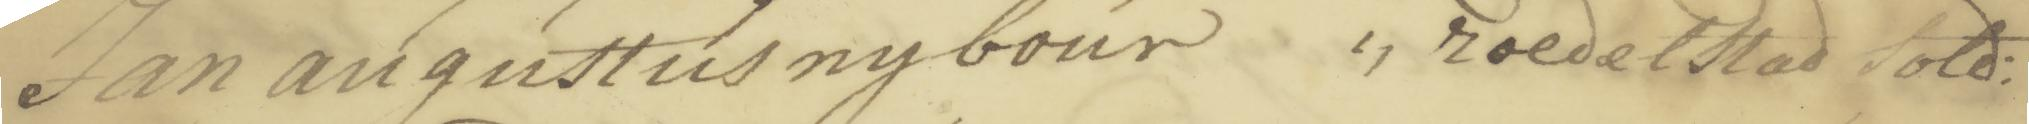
Ian augustus nybour „ roedelstad sold:
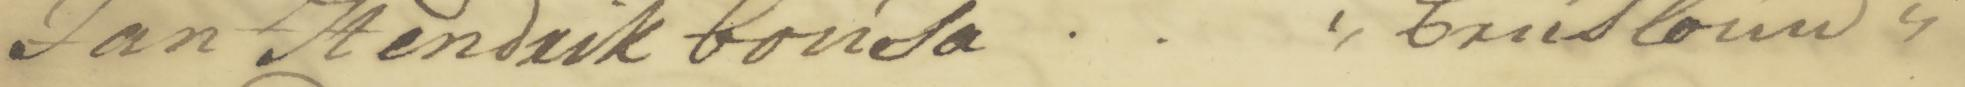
Ian Hendrik bousa . . „ bruslouw „
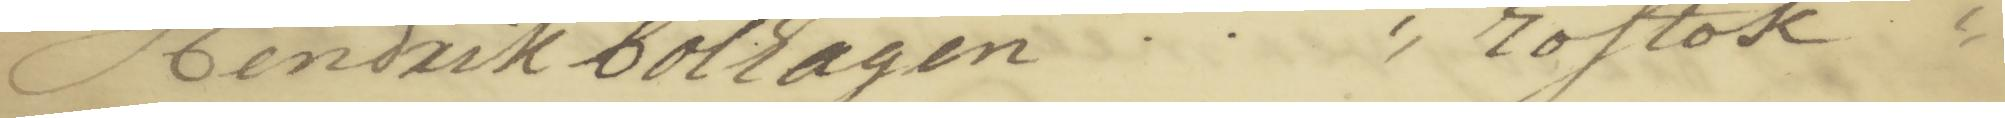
Hendrik bolhagen . . „ rostok „
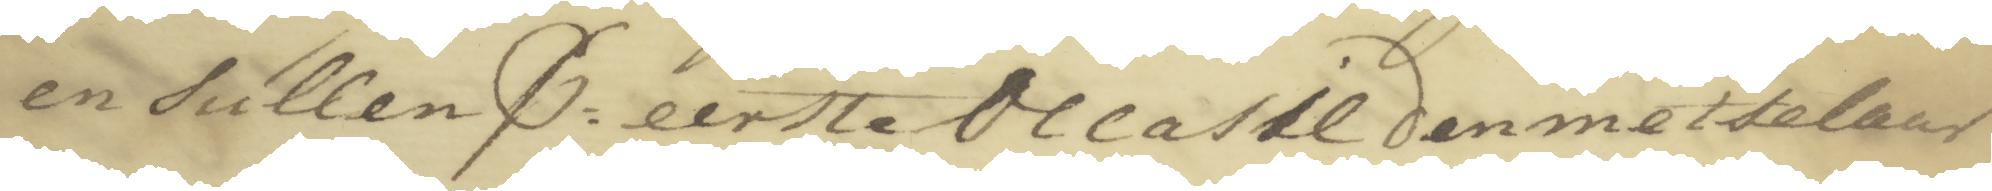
en sullen p=r eerste occasie den metselaar
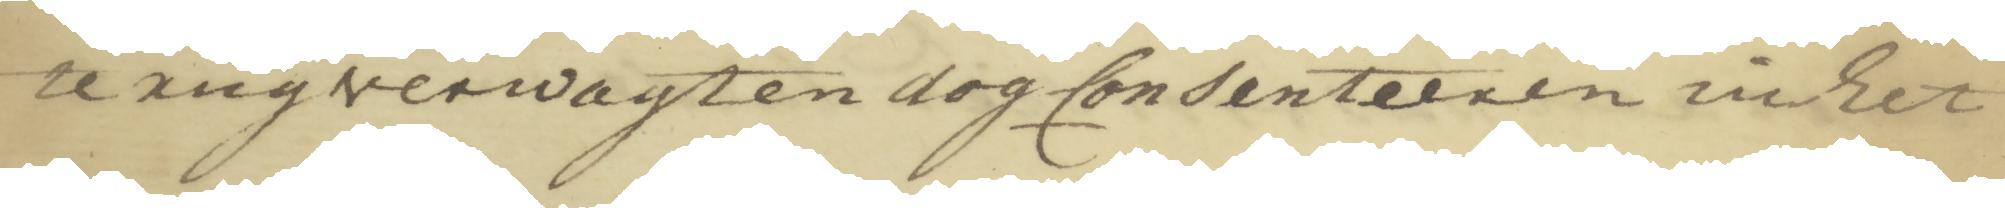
te rug verwagten dog Consenteeren in het
